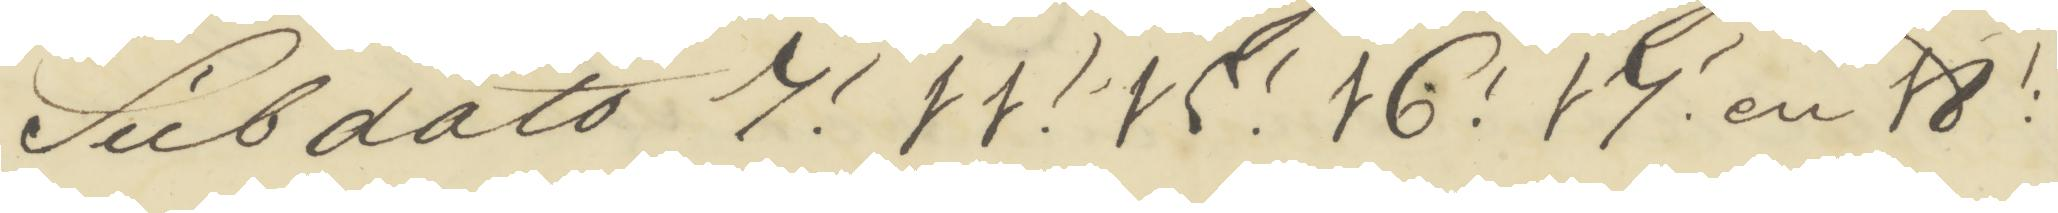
subdato 7.' 11.' 15.' 16.' 17.' en 18:'
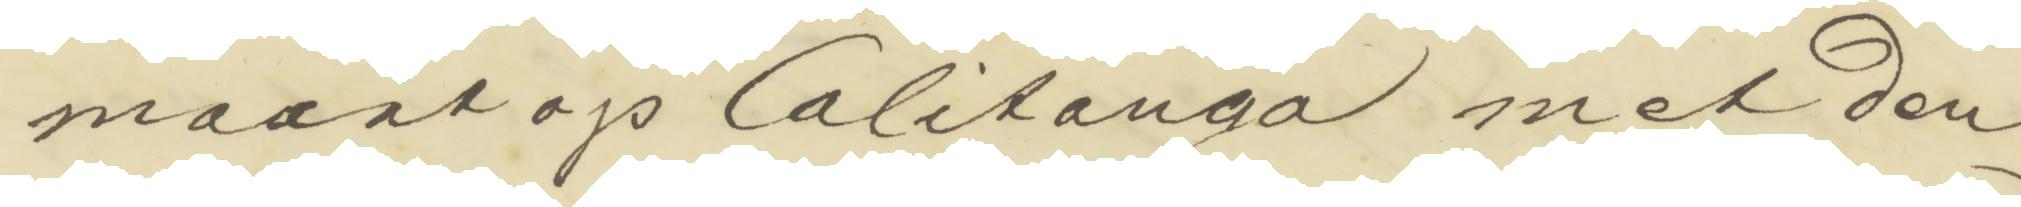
maart op Calitanga met den
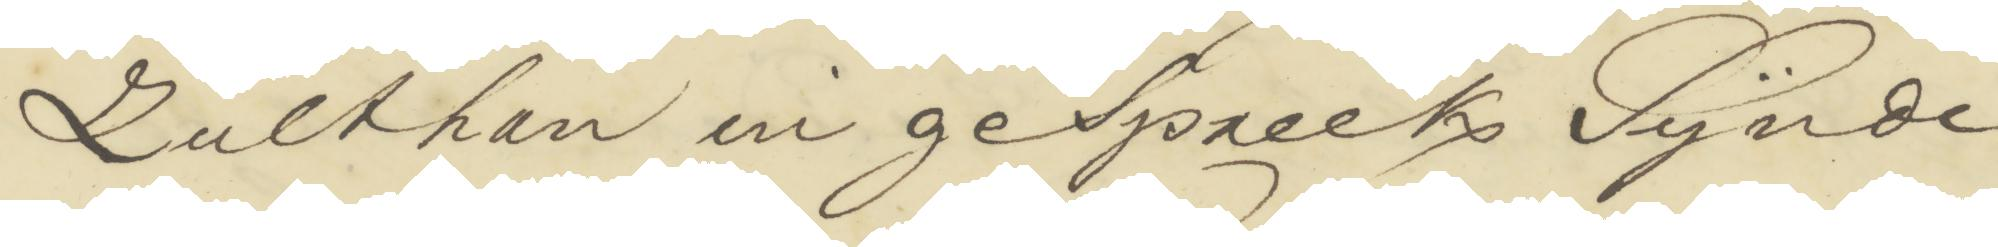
zulthan in gespreek sijnde
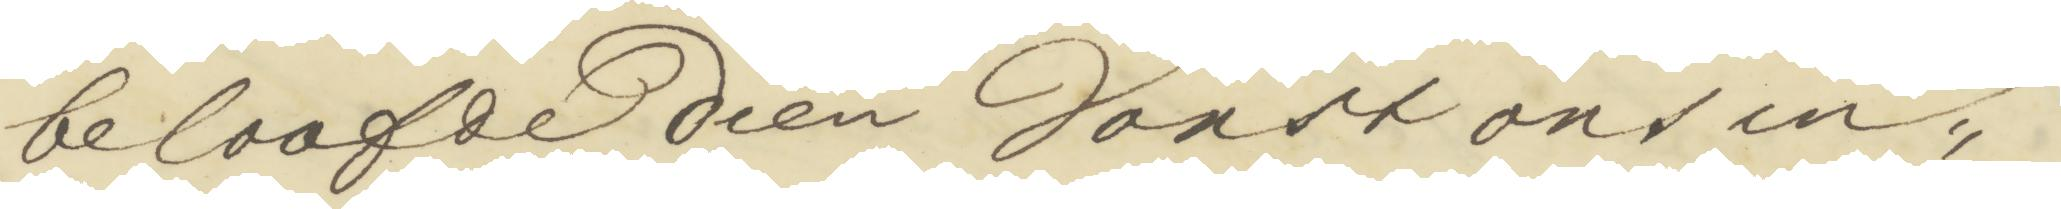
beloofde dien Vorst ons in„
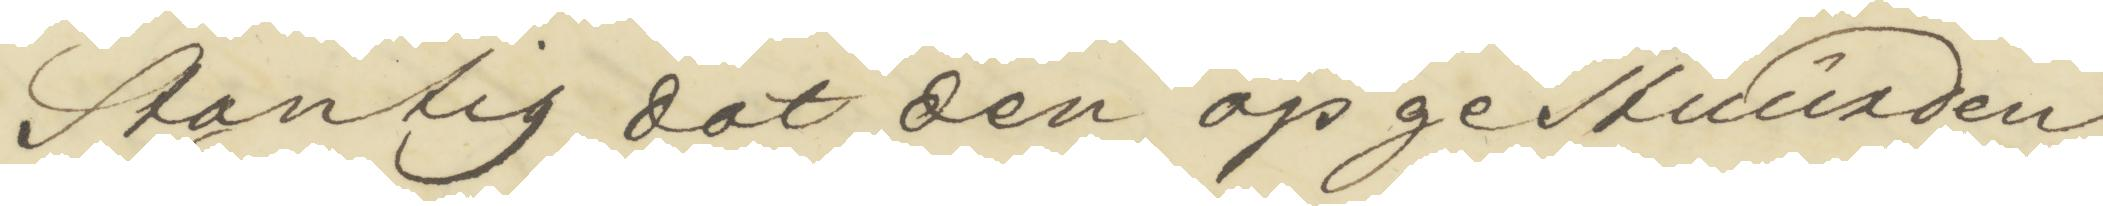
stantig dat den op gestuurden
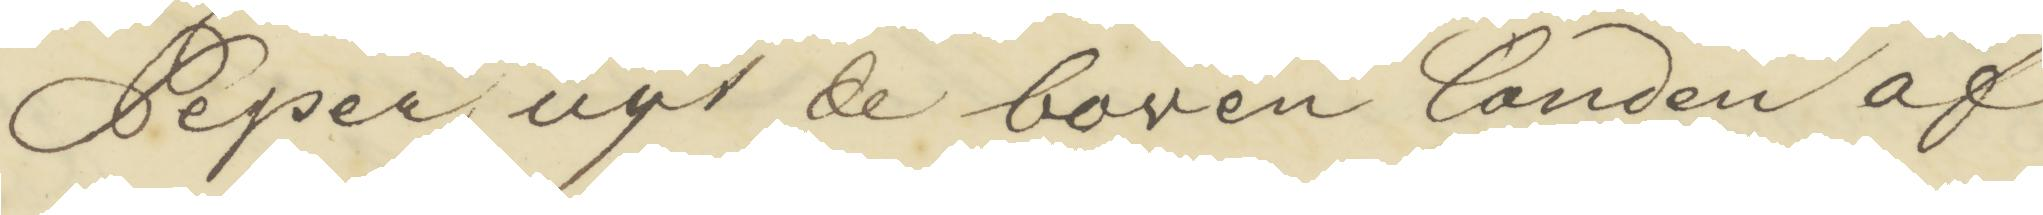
Peper uijt de boven landen af
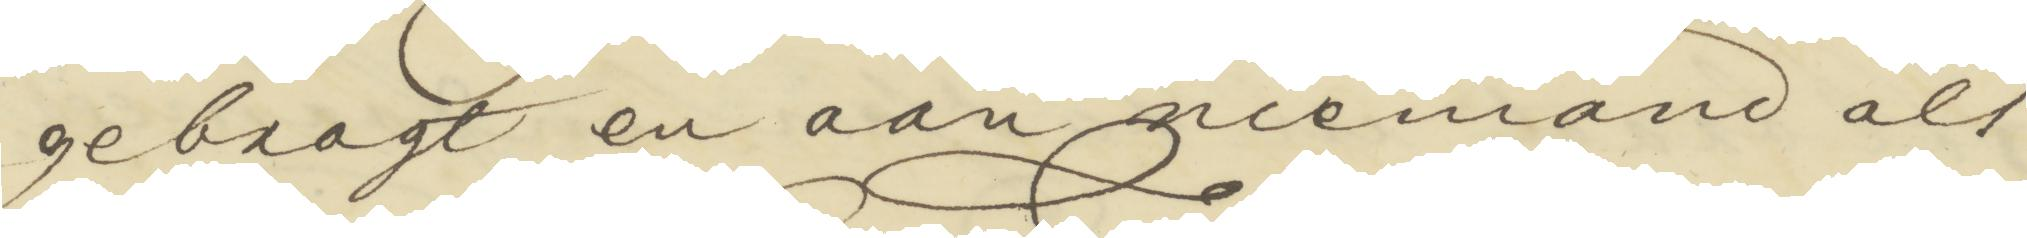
gebragt en aan niemand als
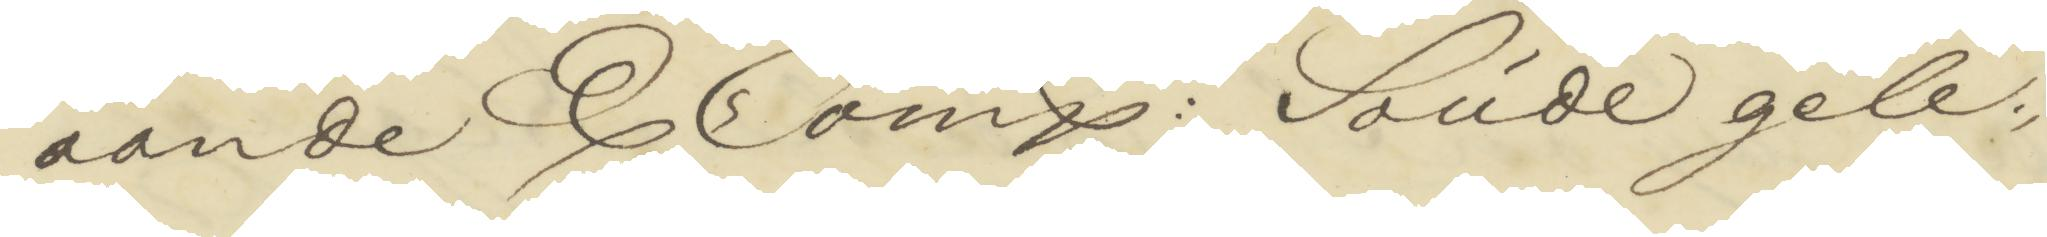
aan de E Comp:e soude gele„
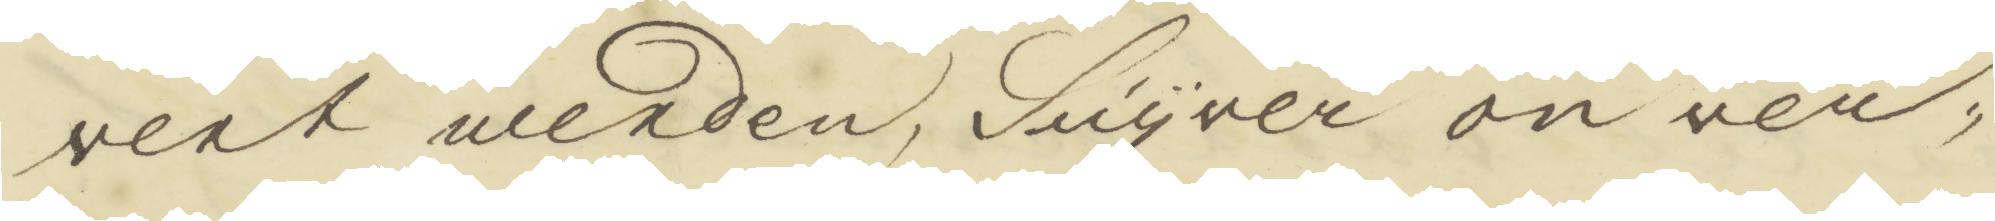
vert werden, suijver on ver„
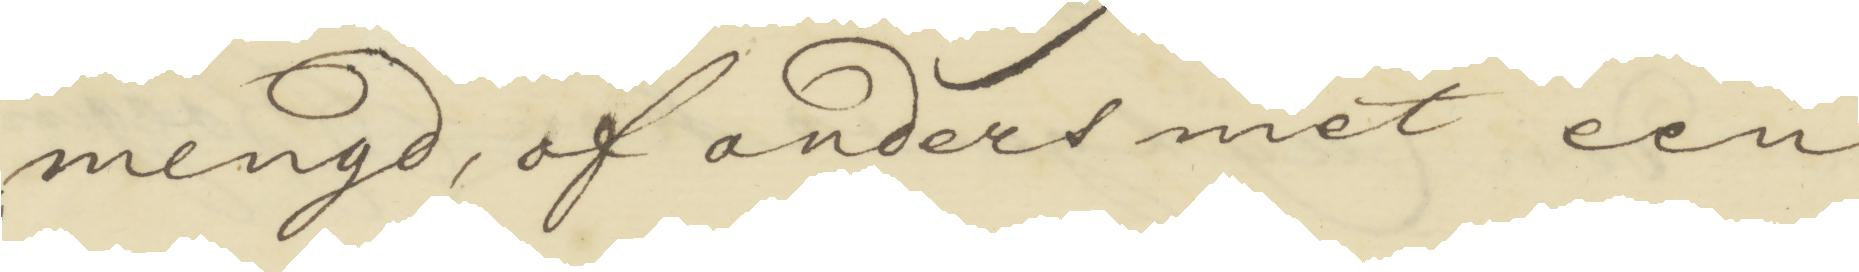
mengd, of anders met een
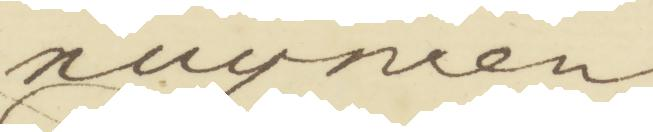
ruijmen
